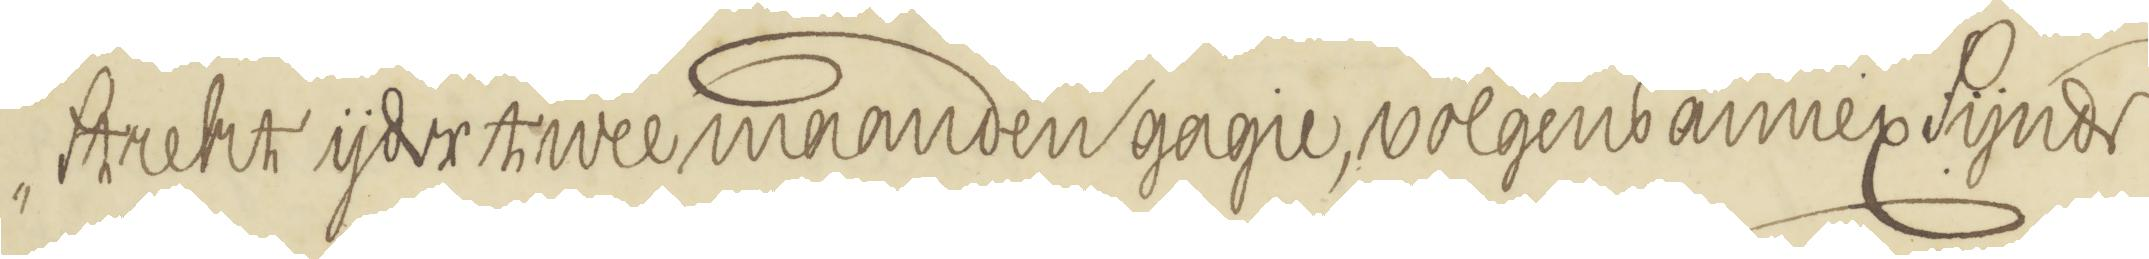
„strekt ijder twee maanden gagie, volgens annex sijnde
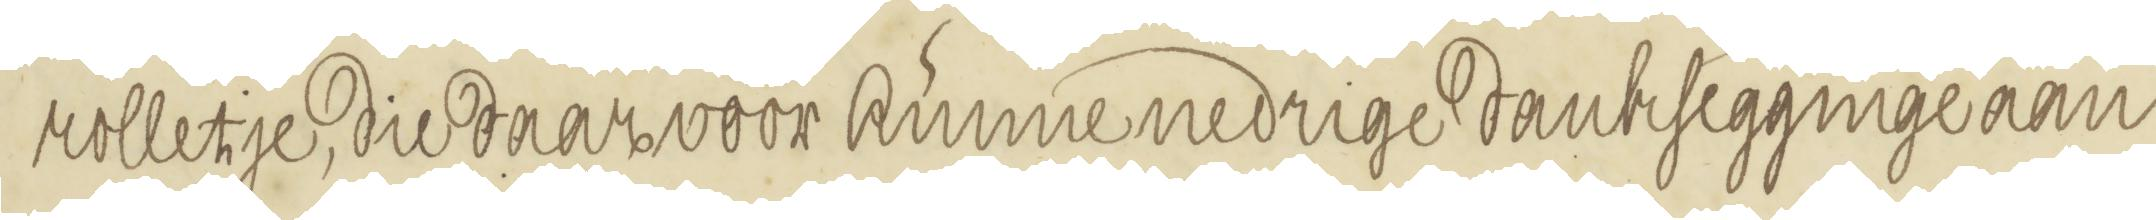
rolletje, die daar voor hunne nedrige danksegginge aan
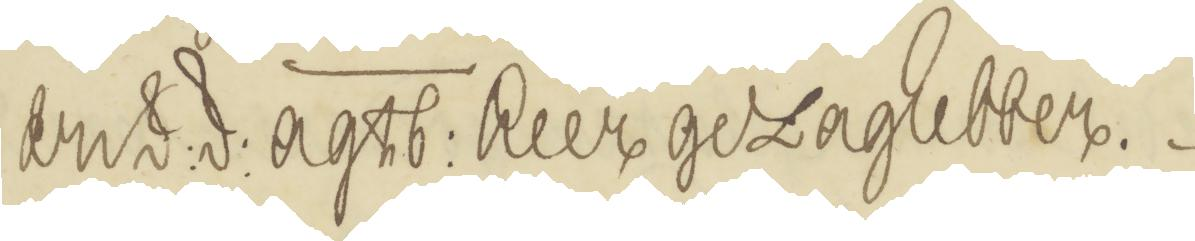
den E: E: agtb: heer gezaghebber.
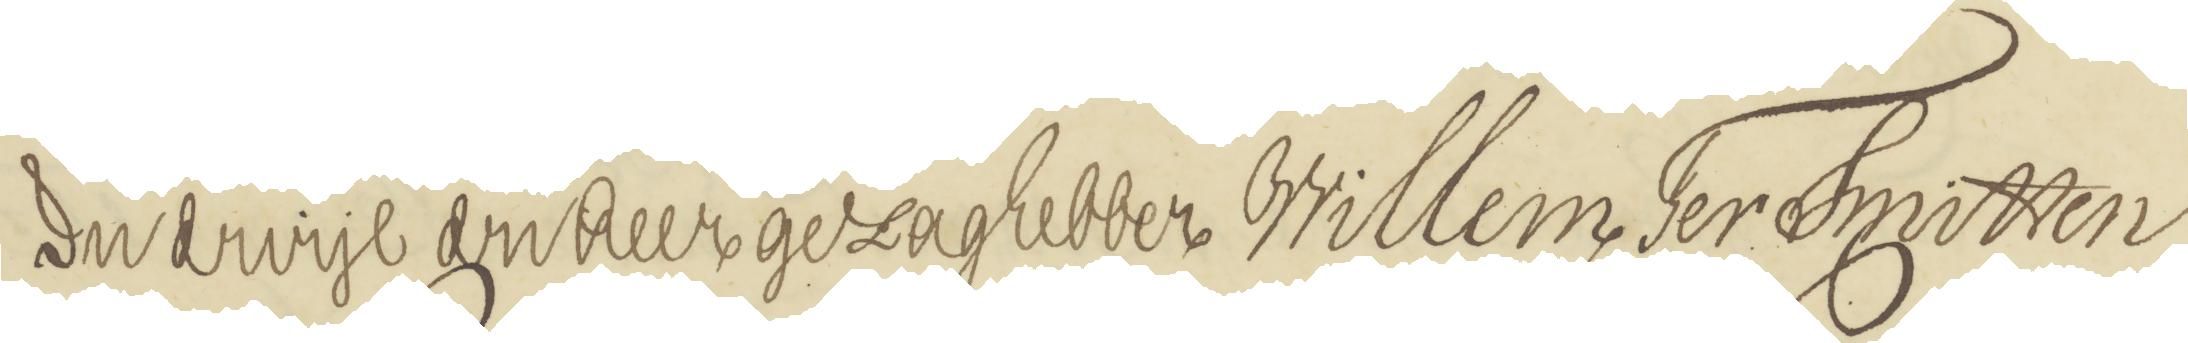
En dewijl den heer gezaghebber Willem Ter Smitten
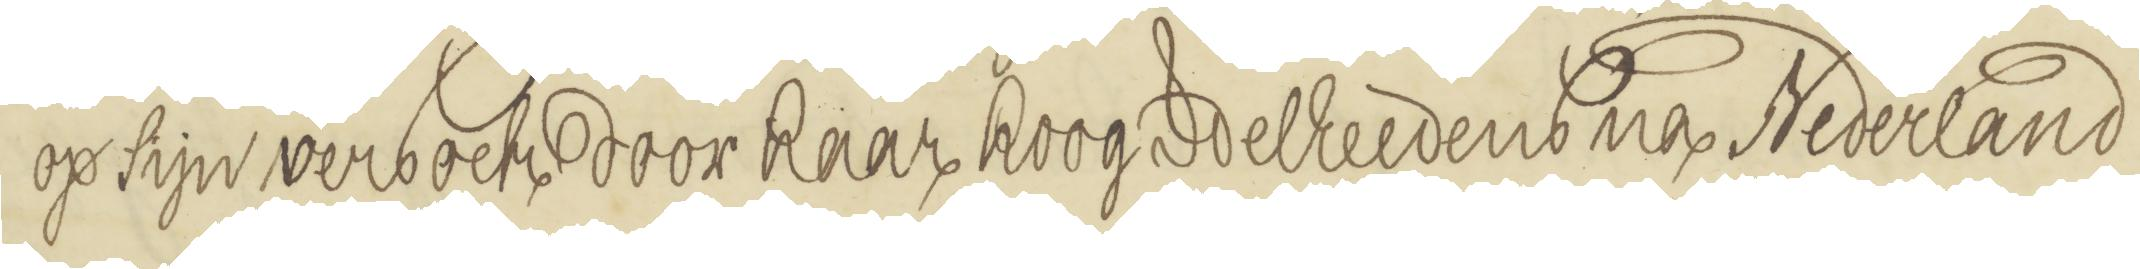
op sijn versoek door haar hoog Edelheedens na Nederland
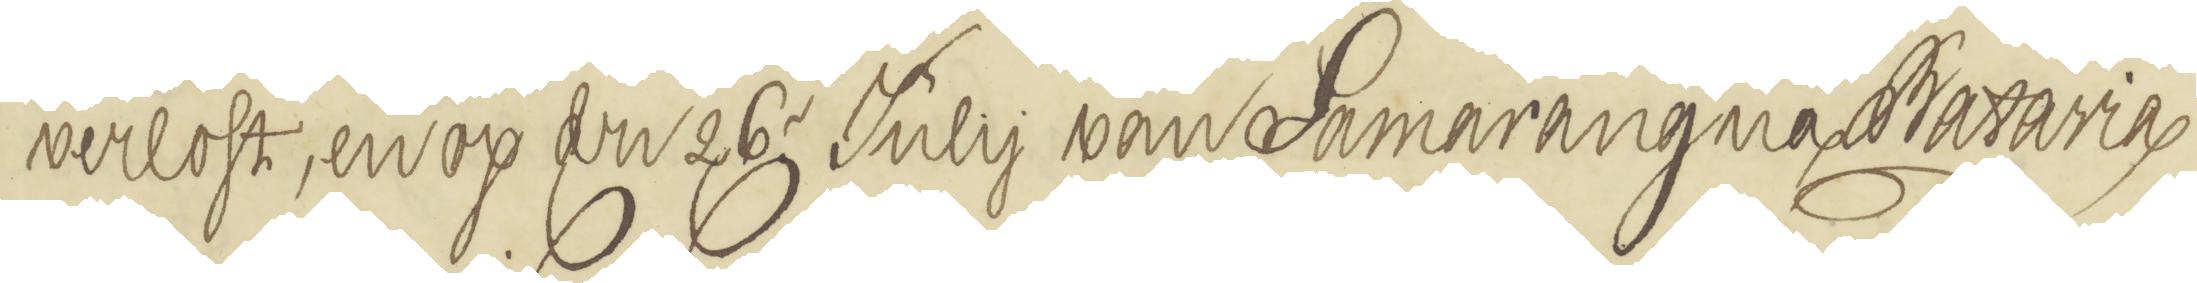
verlost, en op den 26.' Julij van Samarang na Batavia
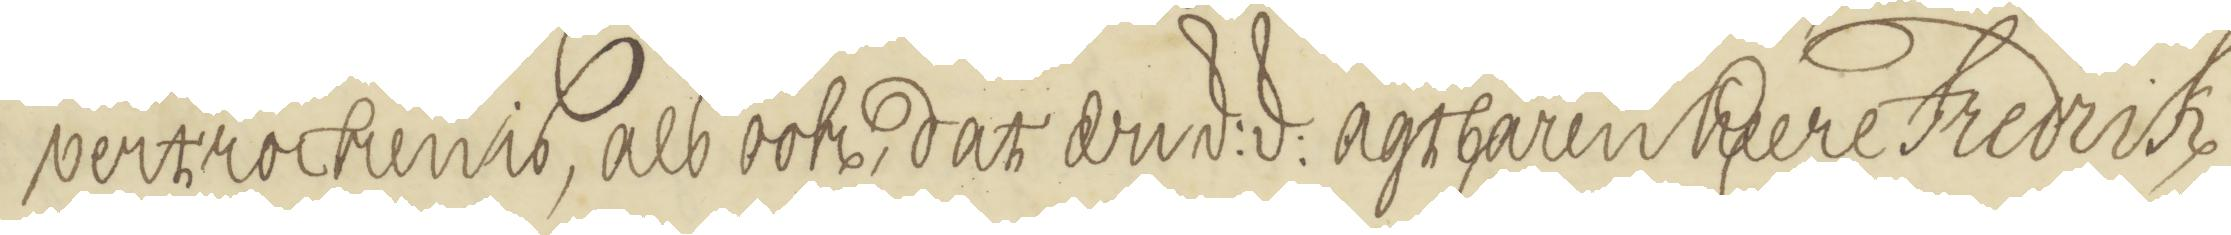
vertrocken is, als ook, dat den E: E: agtbaren heere fredrik
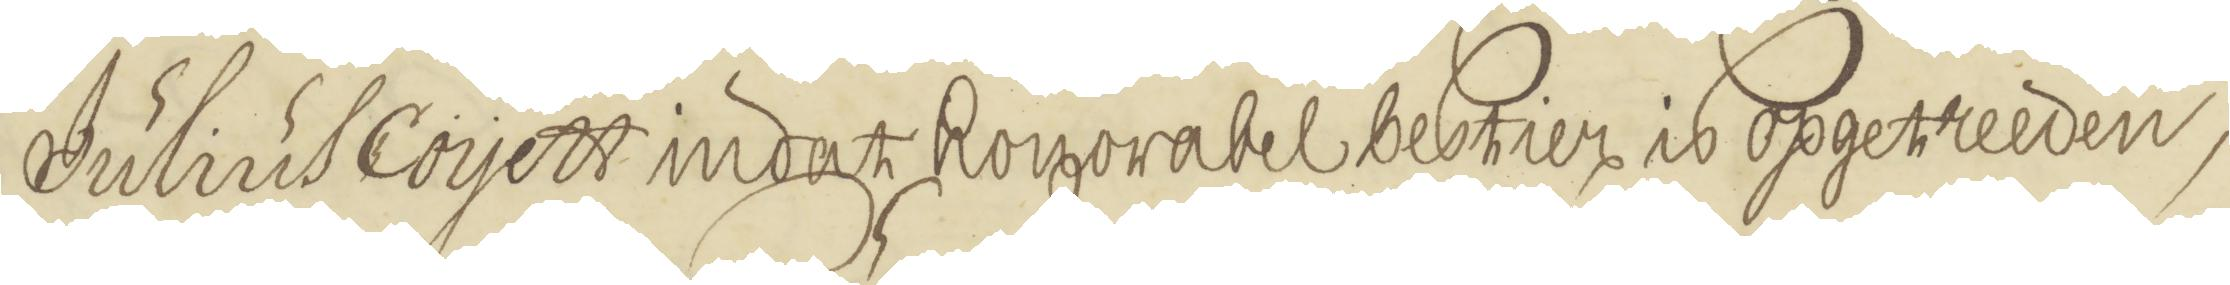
Julius Coijett in dat honorabel bestier is opgetreeden,
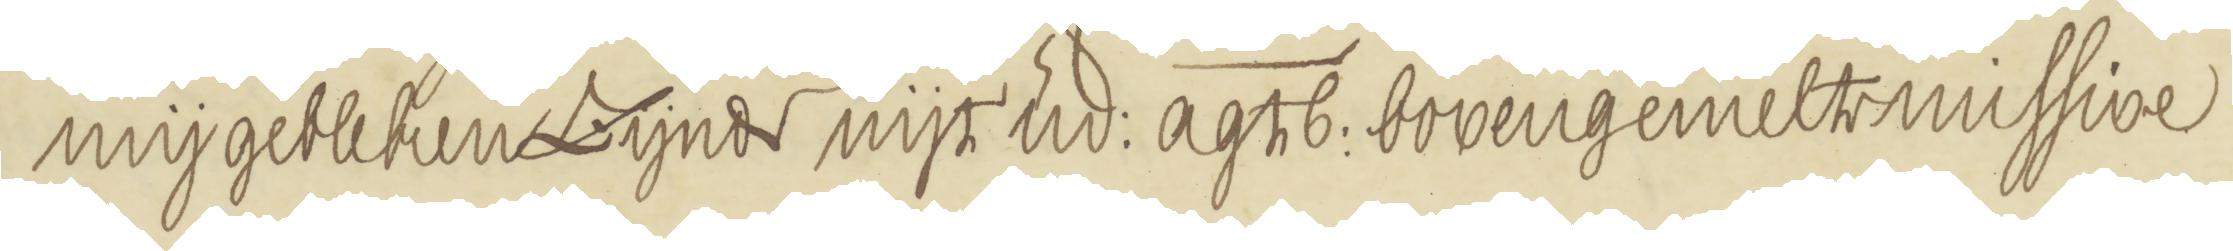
mij gebleken zijnde uijt uE: agtb: bovengemelt missive
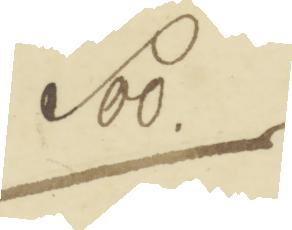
soo.
